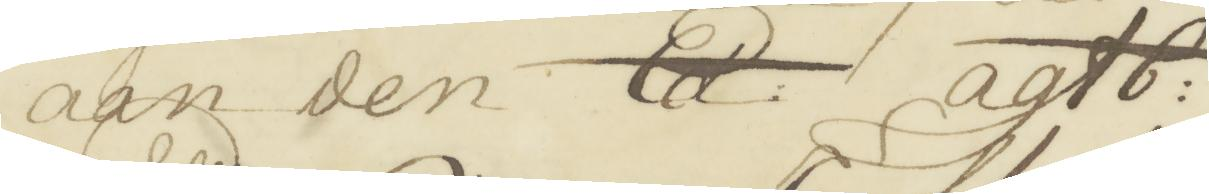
aan den Ed: agtb:
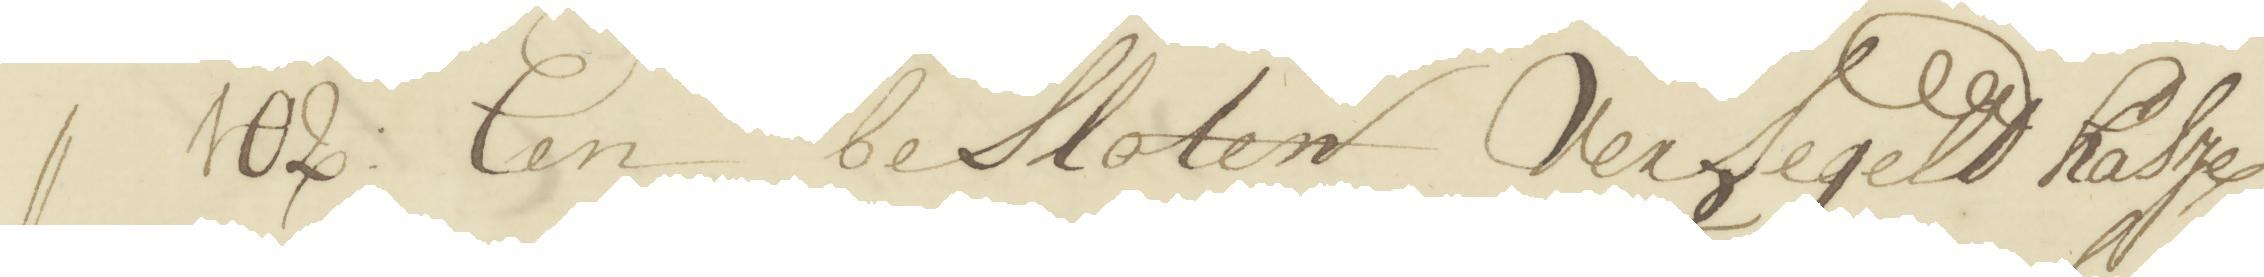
„ 102: Een besloten versegeld kasje
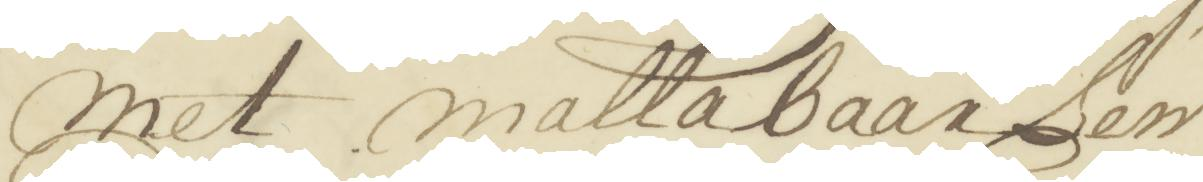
met mallabaarsen
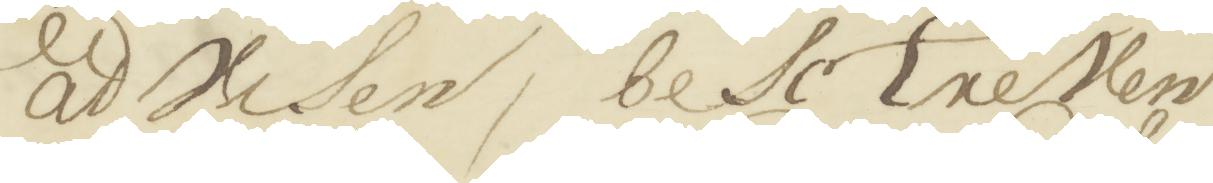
advisen, beschreven
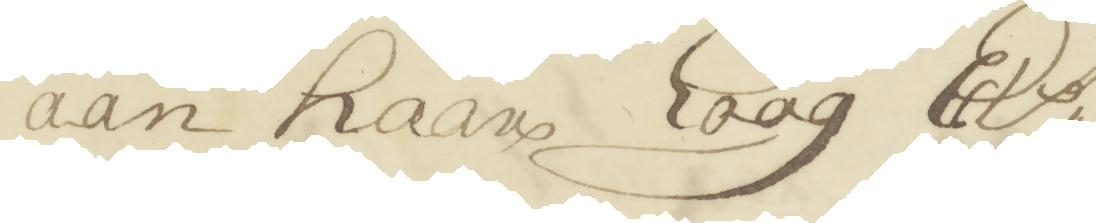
aan haar hoog Ed„
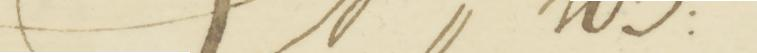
N„o 103:
